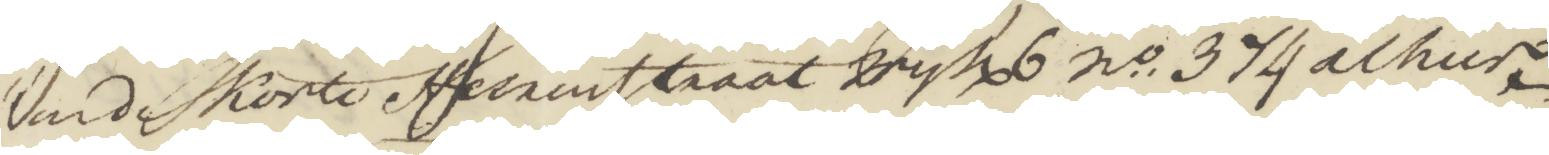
in de Korte Heerenstraat wyk 6 N..o 374 alhier_
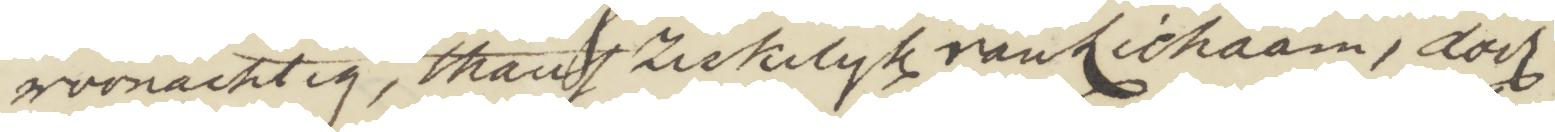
woonachtig, thans ziekelijk van Lichaam, doch
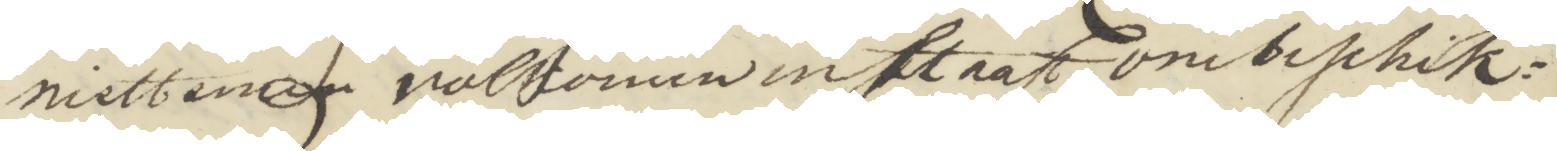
niettemin volkomen in staat om beschik:
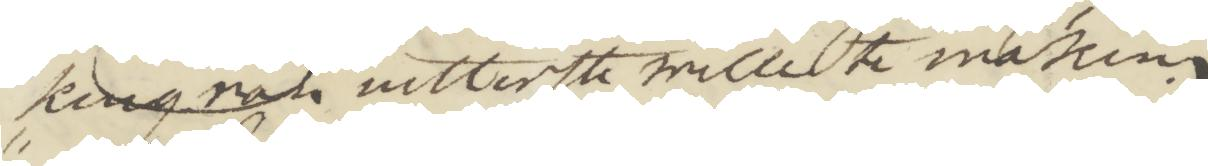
king van uitterste wille te maken.
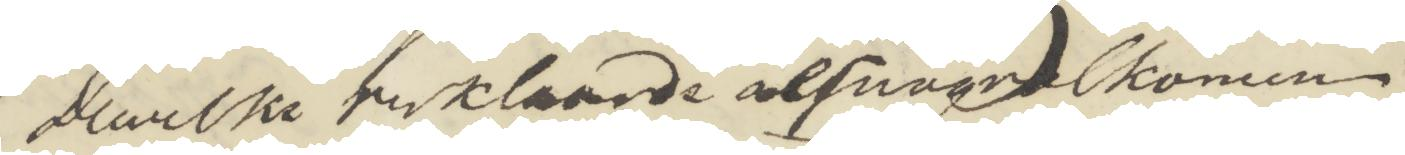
Dewelke verklaarde alsnog volkomen
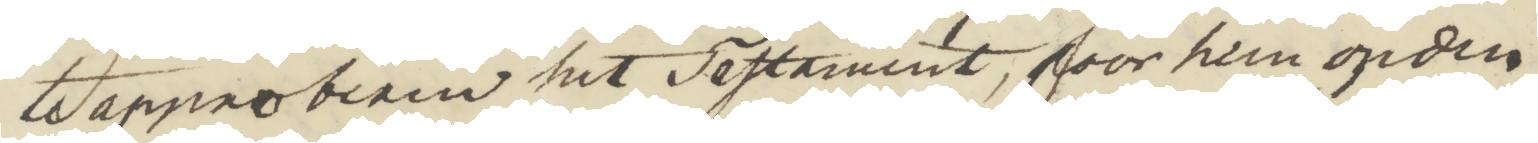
te approberen het Testament, door hem op den
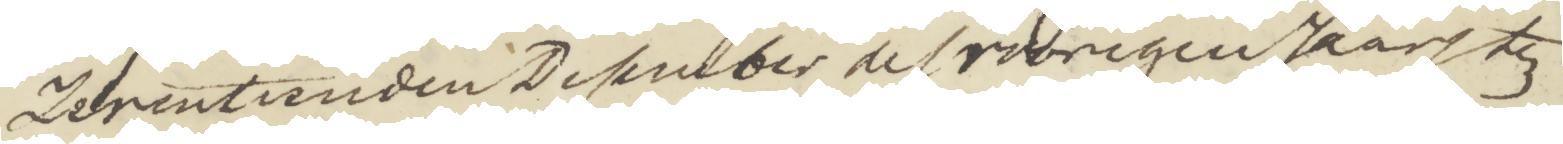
zeventienden December des voorigen Jaars ten
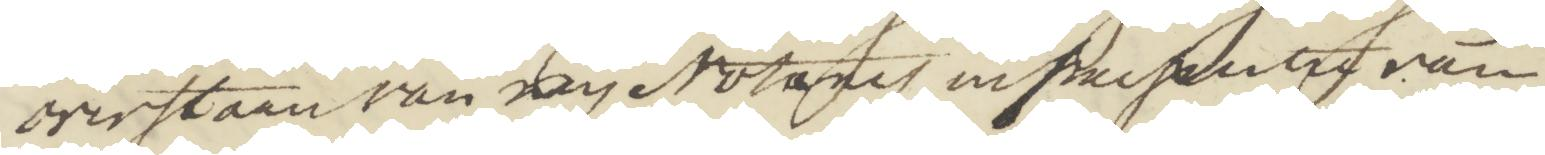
overstaan van my Notaris in presentie van
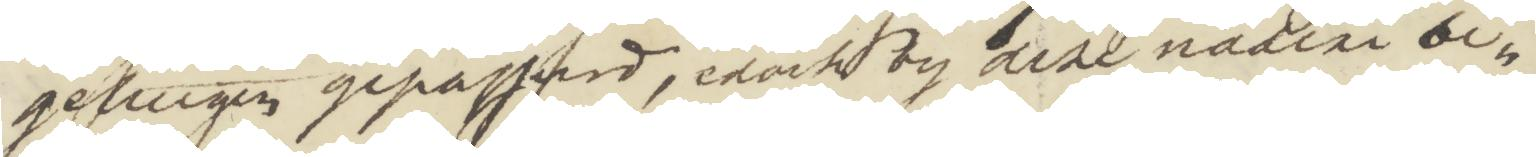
getuigen gepasseerd, edoch by deze nadere be„
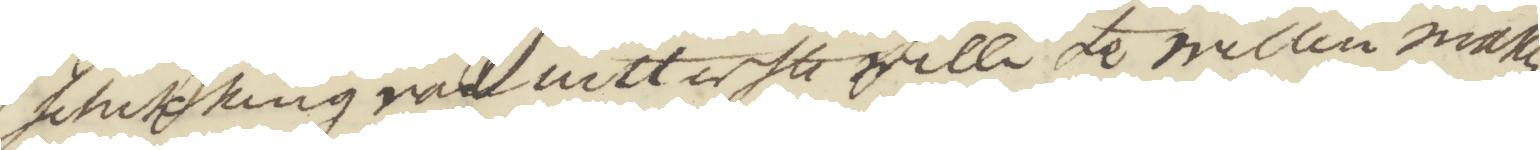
schikking van uitterste wille te willen maken
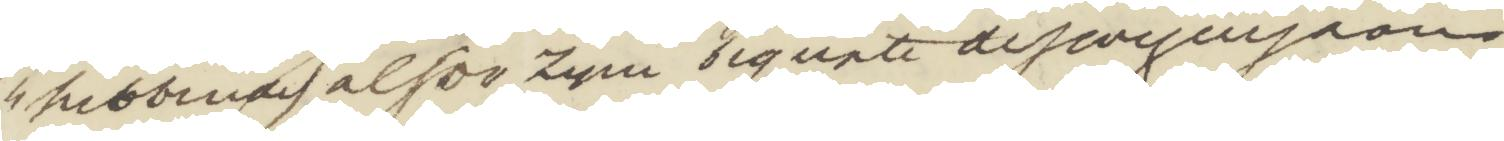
hebbende alsoo zyne begeerte deswegen aan
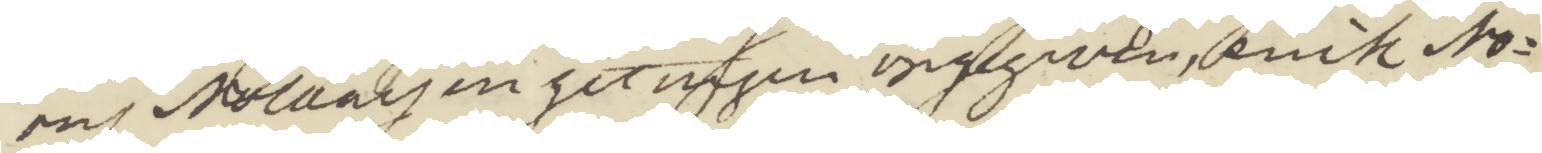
ons Notaris en getuigen opgegeven, en ik No=
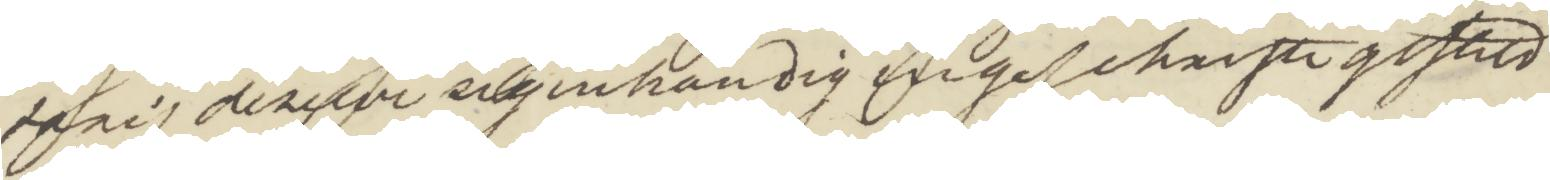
taris dezelve eigenhandig ingeschrifte gesteld
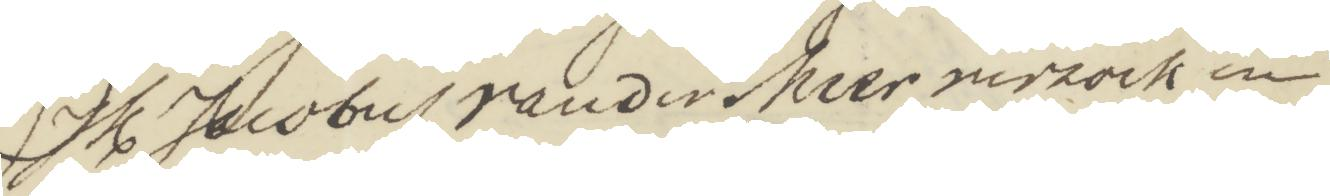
Ik Jacobus van der Meer verzoek en
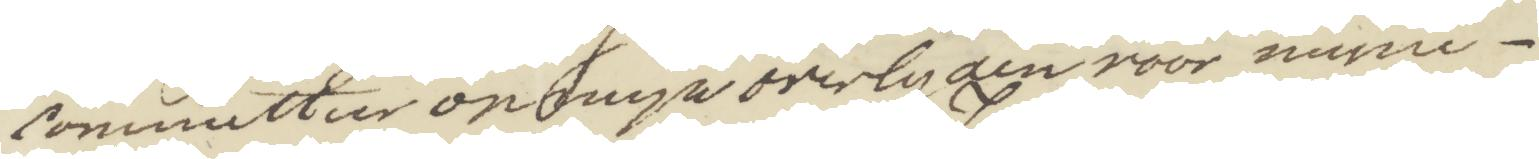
committeer op myn overlyden voor myne -
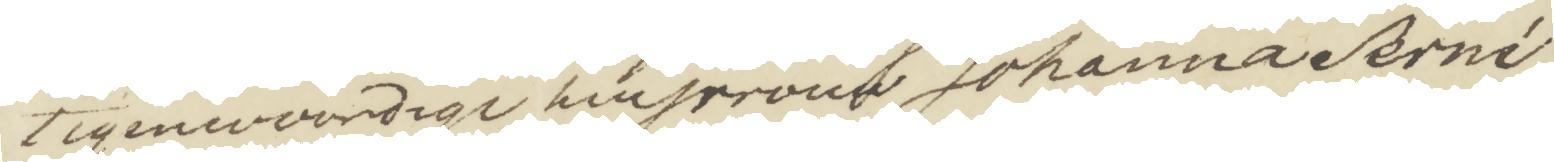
tegenwoordige huisvrouw Johanna Serné,
